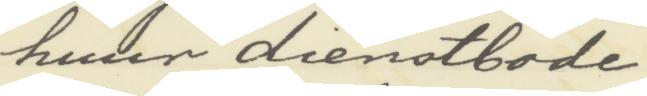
huur dienstbode
